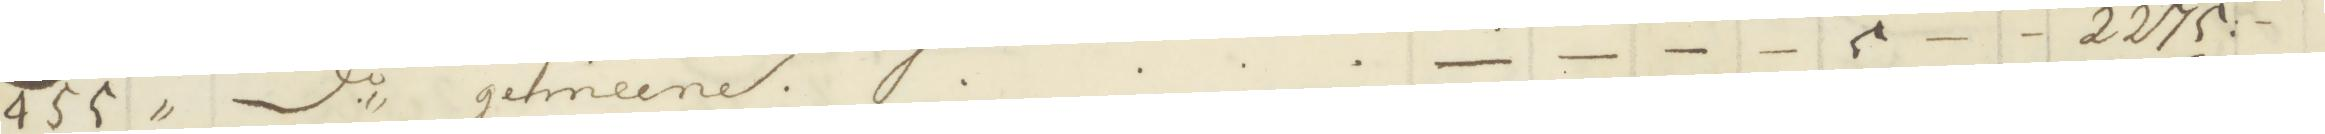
455 „ _/o gemeene. . . . . — — — — 5 — — 2275: -
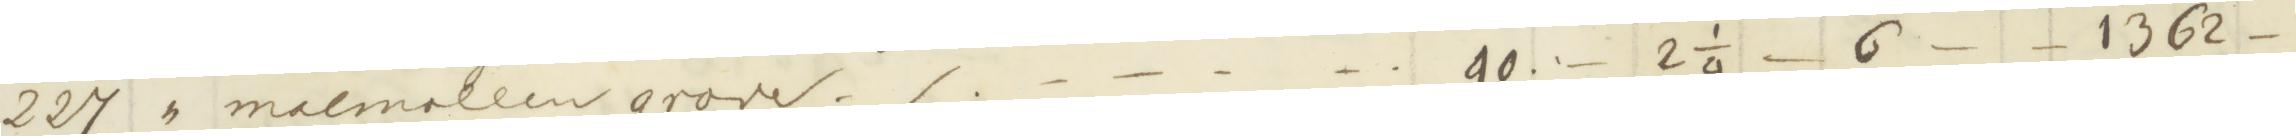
227 „ malmollen grove - - - - - - - 40. — 2¼ — 6 — — 1362 —
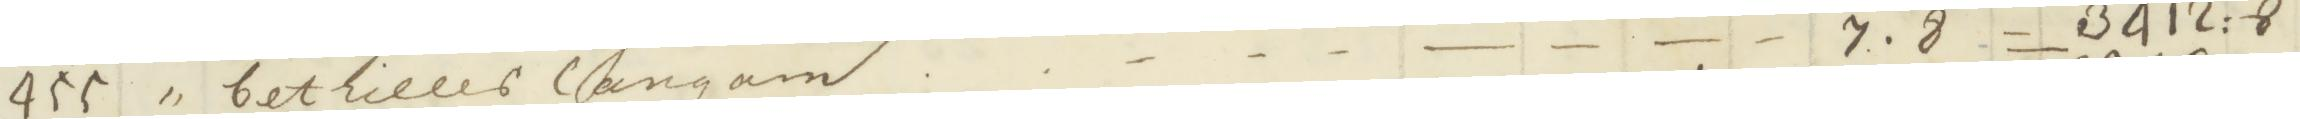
455 „ bethilles cangam - - - - - — — — — 7. 8 — 3412: 8
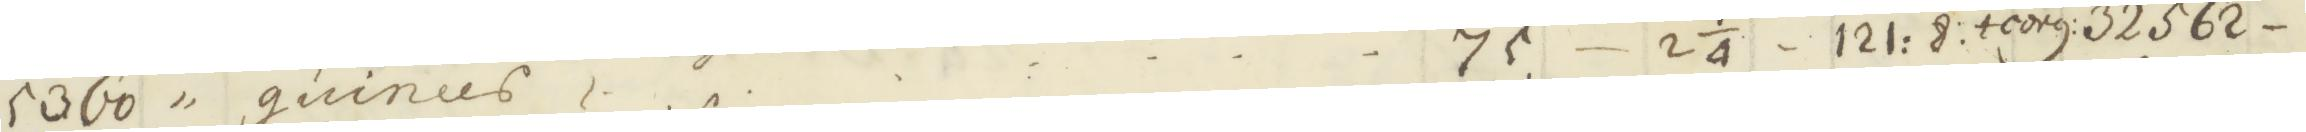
5360 „ guinees - - - - - - - 75 — 2¼ — 121: 8: +corg: 32562 —
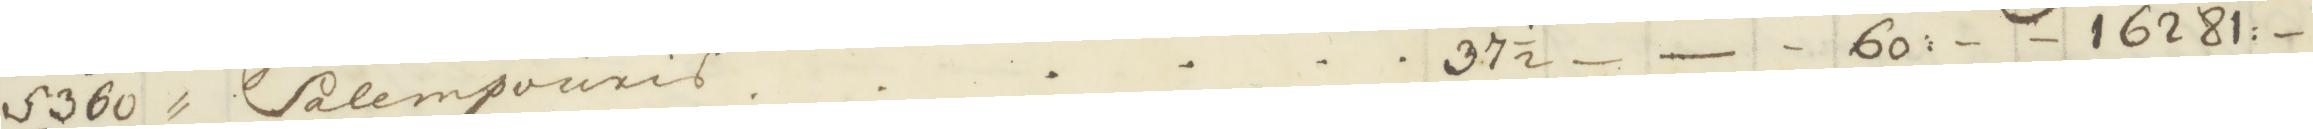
5360 „ salempouris . . . . . . 37½ — — — 60: — — 16281: —
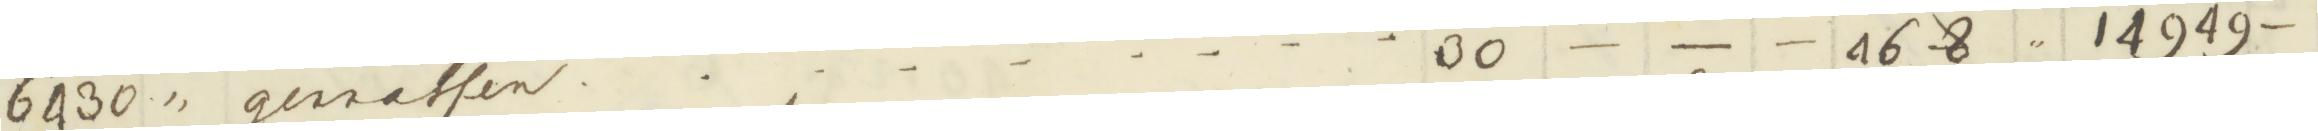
6430 „ gerrassen - - - - - - - - - 30 — — — 46 8 „ 14949—
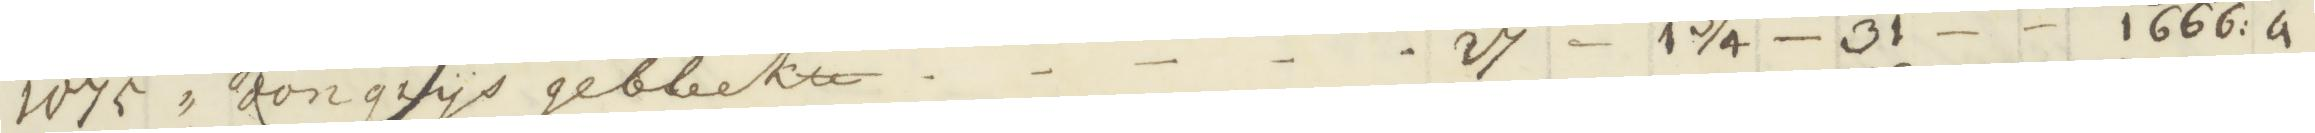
1075 „ dongrijs gebleekte - - - - - 27 — 1¾ — 31 — — 1666: 4
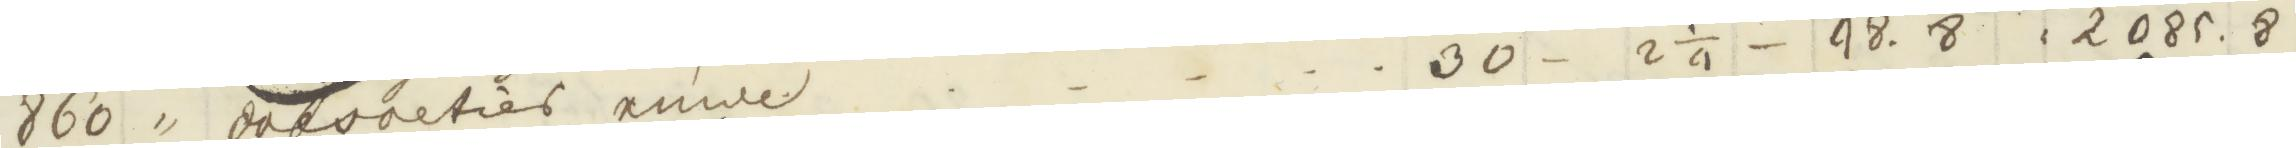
860 „ daesoeties ruwe - - - - - 30 — 2¼ — 48. 8 „ 2088. 8
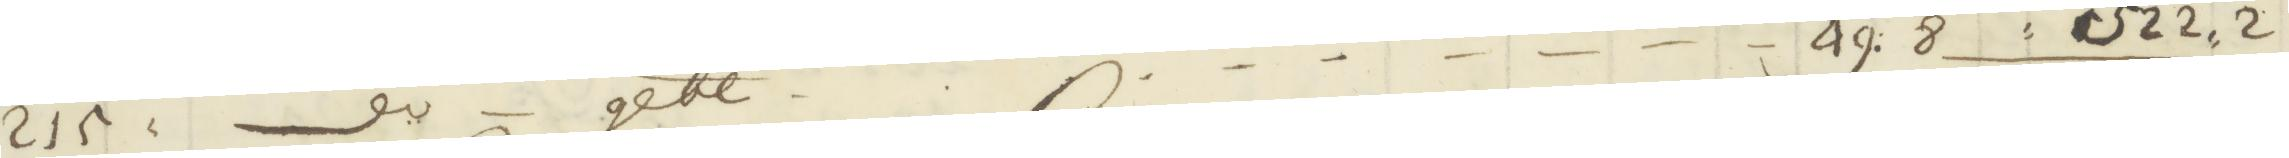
215 „ _/o — gebl - - - - - - — — — — 49: 8 „ 522„ 2
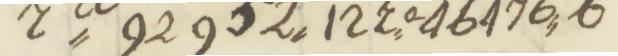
r„a 92952„ 12r„a46476„6
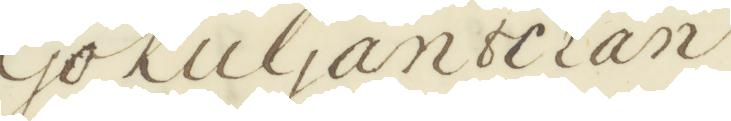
Gokuljantchan
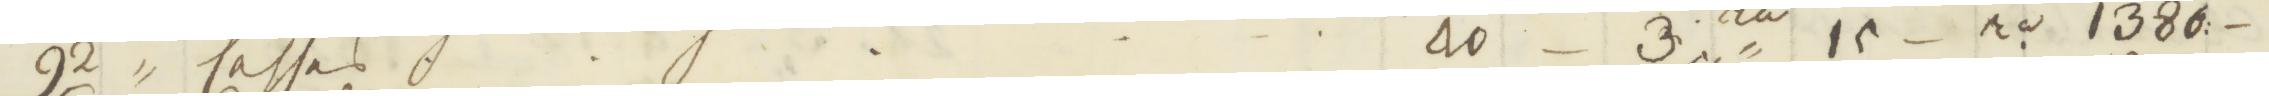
92 „ Cassas . . . . . 40 — 3 „ra 15 — r.a 1380: —
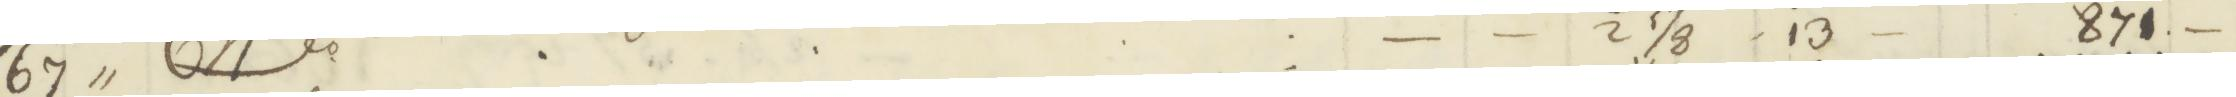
67 „ _/o . . . . — — 2 5/8 13 — 871.—
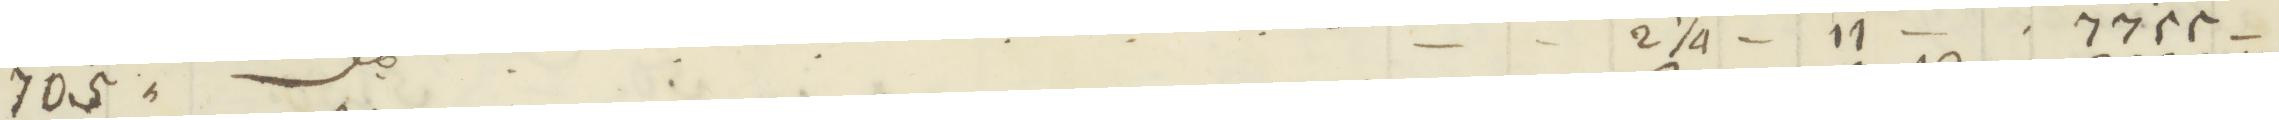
705 „ _/o . . . . . . . — — 2 ¼ — 11 — , 7755 —
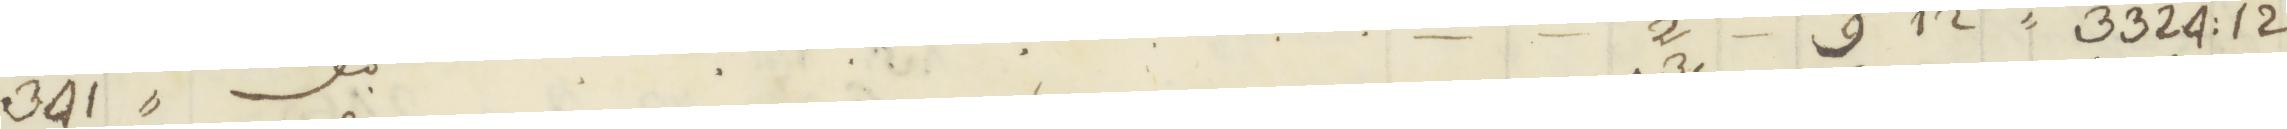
341 „ _/o . . . . . . . — — 2 — 9 12 „ 3324:12
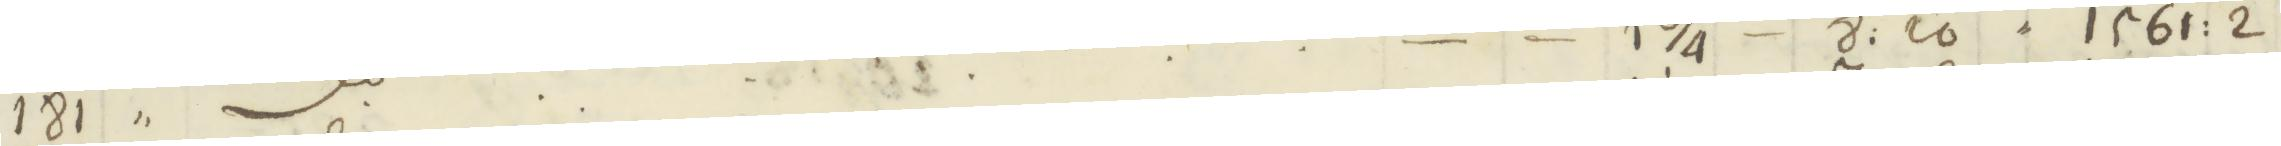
181 „ _/o . . . . . — — 1 ¾ — 8: 10 „ 1561: 2
